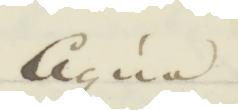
Aqua
